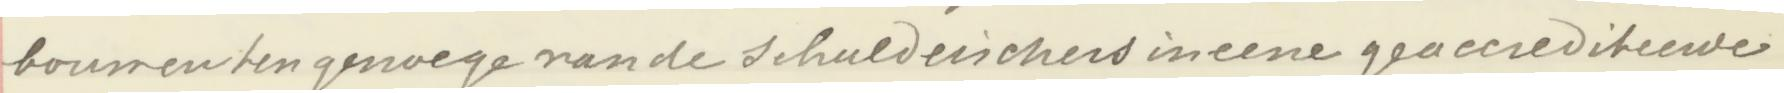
bouwen ten genoege van de schuldeischers in eene geaccrediteerde
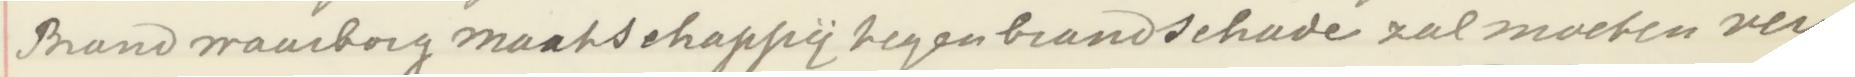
Brand waarborg maatschappij tegen brandschade zal moeten ver
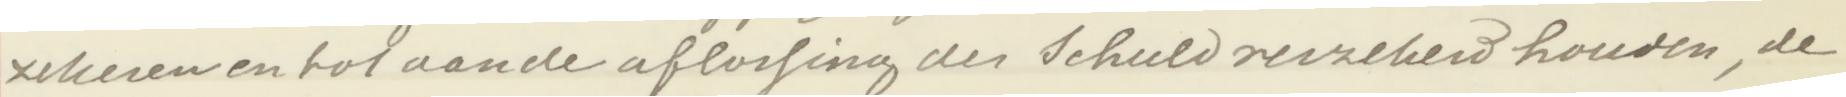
zekeren en tot aan de aflossing der schuld verzekerd houden, de
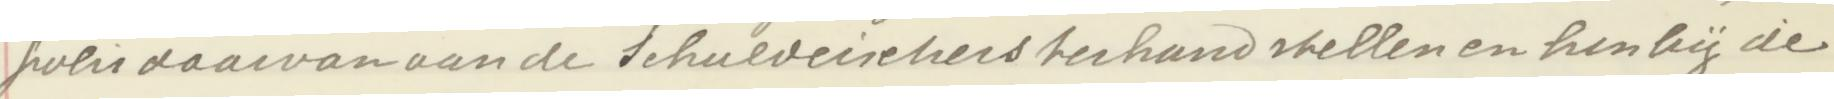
polis daarvan aan de schuldeischers terhand stellen en hen bij de
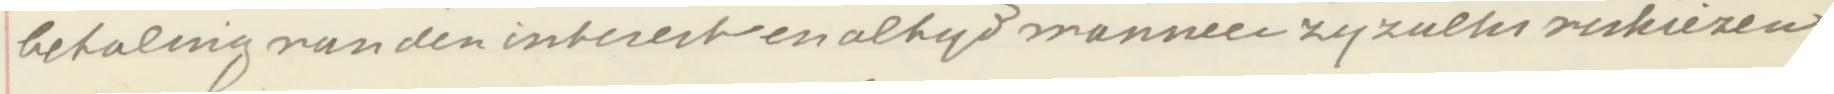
betaling van den interest en altyd wanneer zy zulks verkiezen
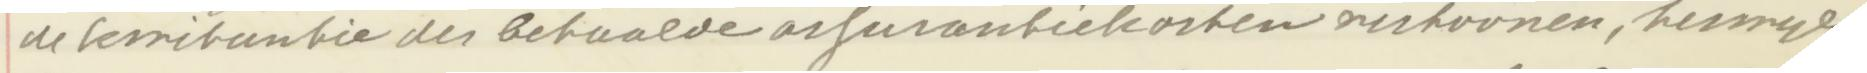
de kwitantie der betaalde assurantiekosten vertoonen, terwyl
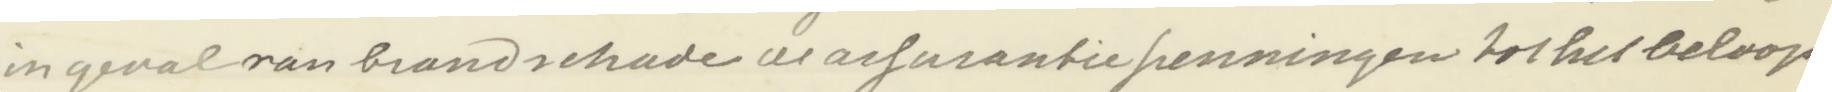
in geval van brandschade de assurantiepenningen tot het beloop
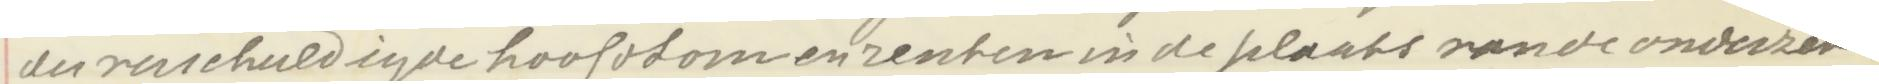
der verschuldigde hoofdsom en renten in de plaats van de onderzet
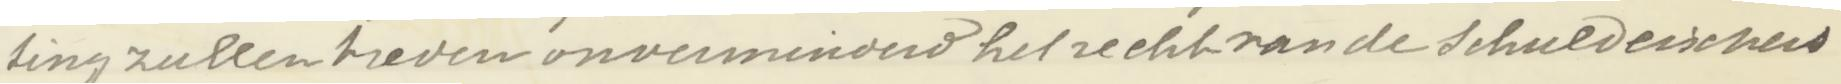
ting zullen treden onverminderd het recht van de schuldeischers
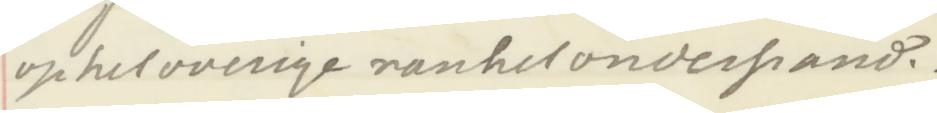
op het overige van het onderpand.
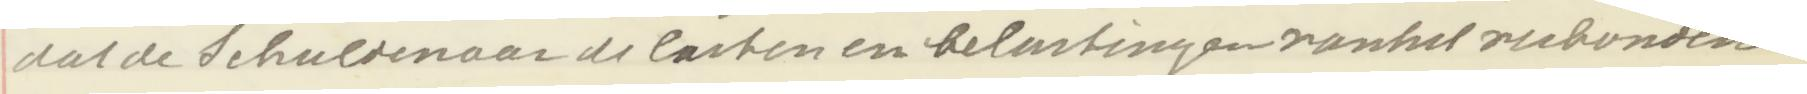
dat de schuldenaar de lasten en belastingen van het verbondene
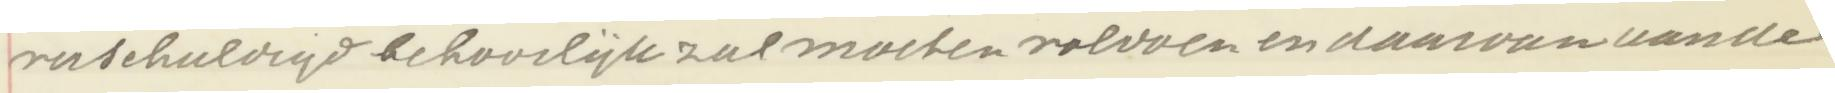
verschuldigd behoorlijk zal moeten voldoen en daarvan aan de
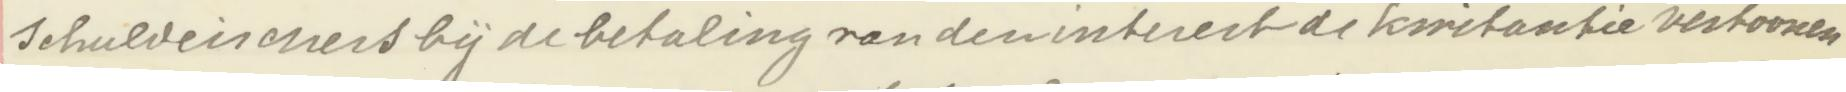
schuldeischers bij de betaling van den interest de kwitantie vertoonen
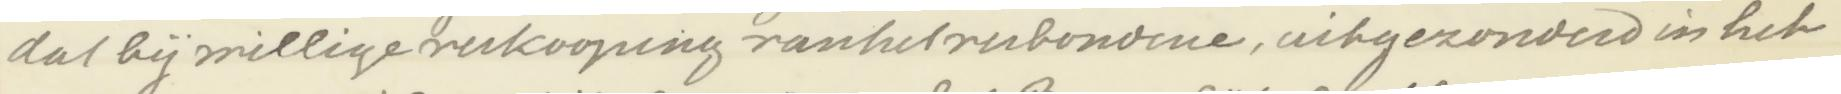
dat bij willige verkooping van het verbondene, uitgezonderd in het
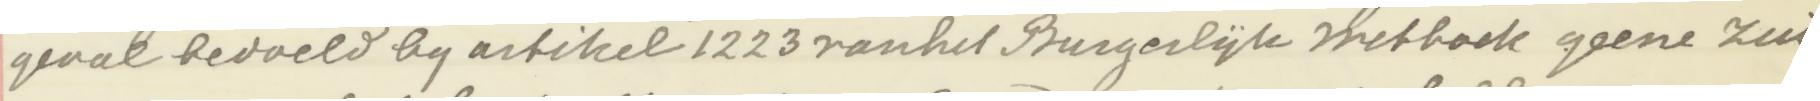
geval bedoeld by artikel 1223 van het Burgerlijk Wetboek geene zui
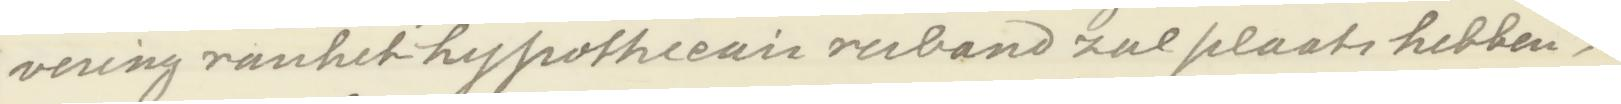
vering van het hypothecair verband zal plaats hebben.
